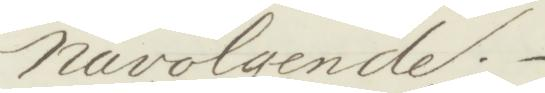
Navolgende.-
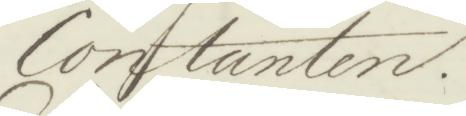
Contanten.
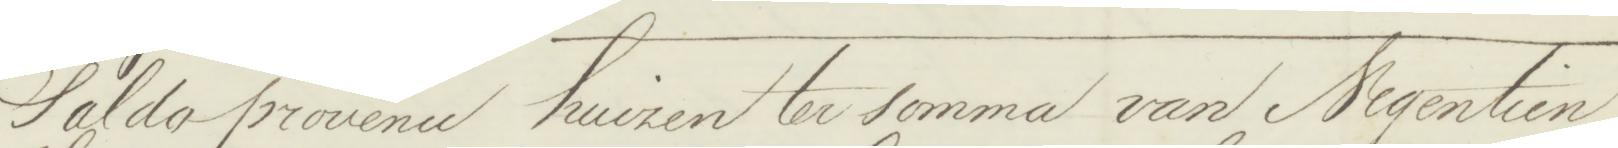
Saldo provenu huiren ter somma van Negentien
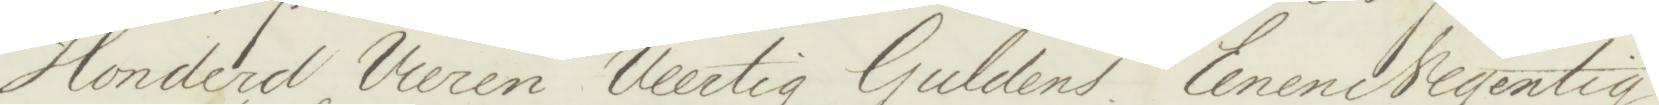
Honderd Vieren Veertig Guldens Eenen Negentig
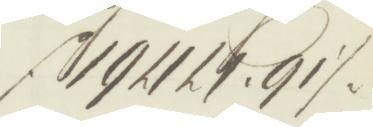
ƒ119447.91½
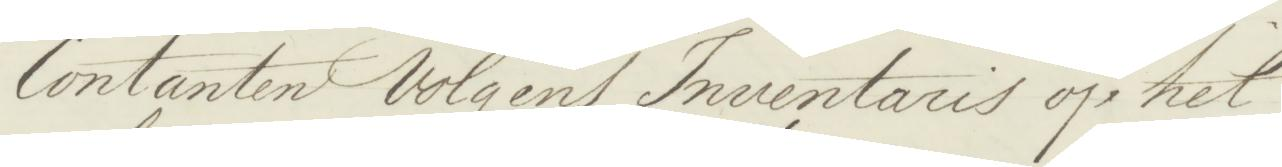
Contanten volgens Inventaris op het
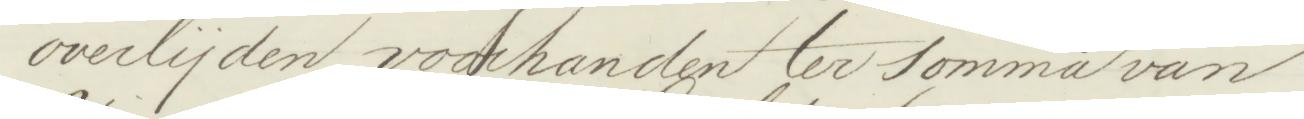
overlijden voorhanden ter somma van
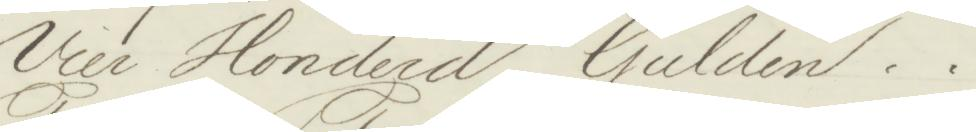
Vier Honderd Gulden
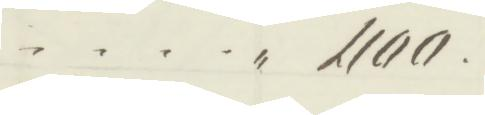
440.
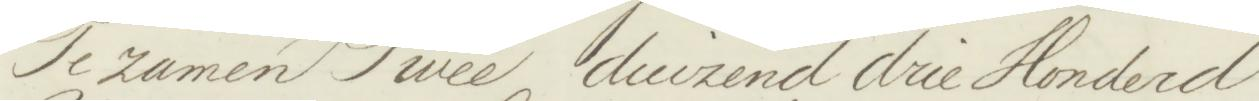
Te zamen Twee duizend drie Honderd
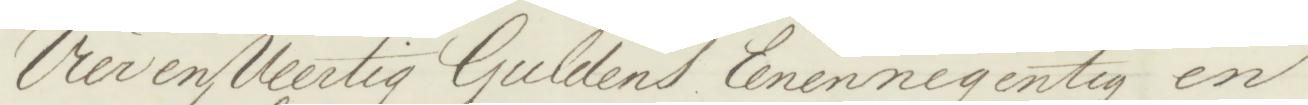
Vier en Veertig Guldens Eenennegentig en
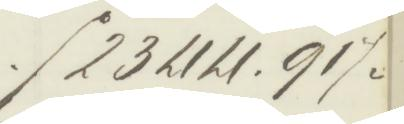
ƒ 2344.91½
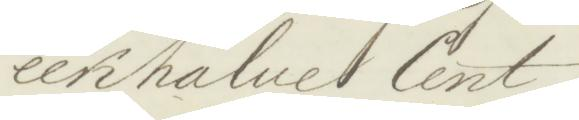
een halve Cent
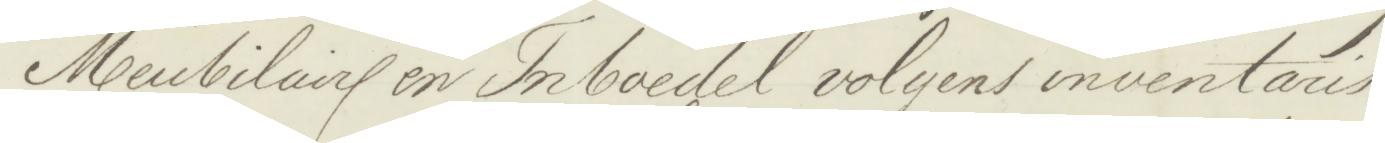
Meubiluurs en Inboedel volgens inventaris
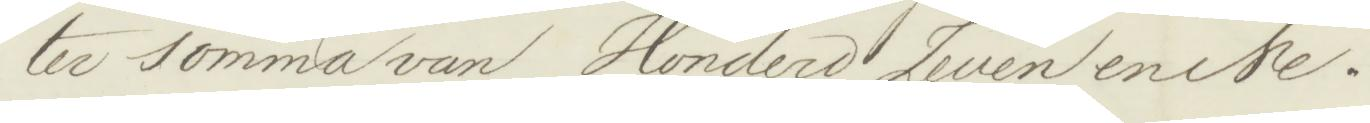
ter somma van Honderd Zeven en Ne„
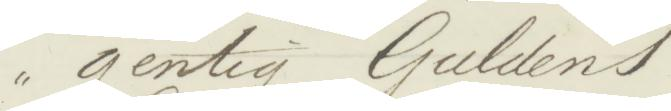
„gentig Guldens
